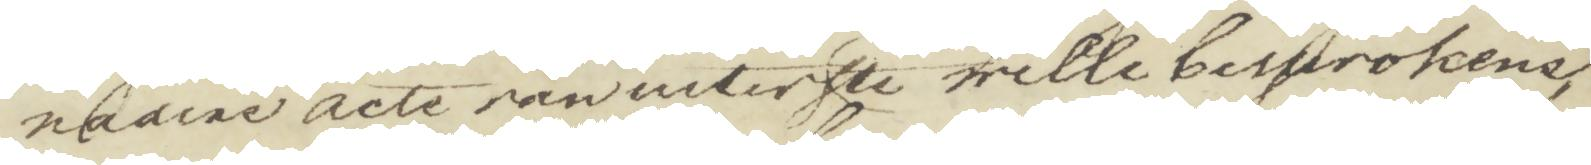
nadere acte van uiterste wille besprokene,
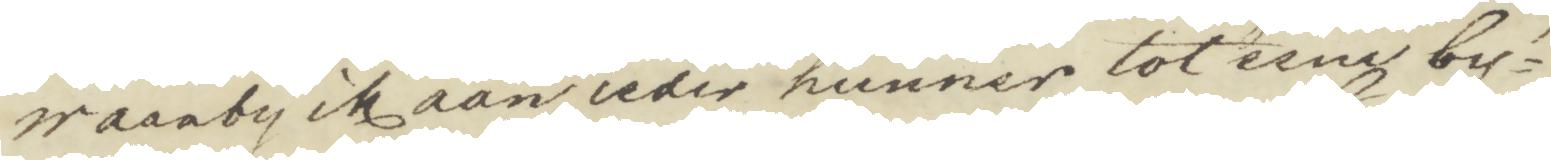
waarby ik aan ieder hunner tot eene by=
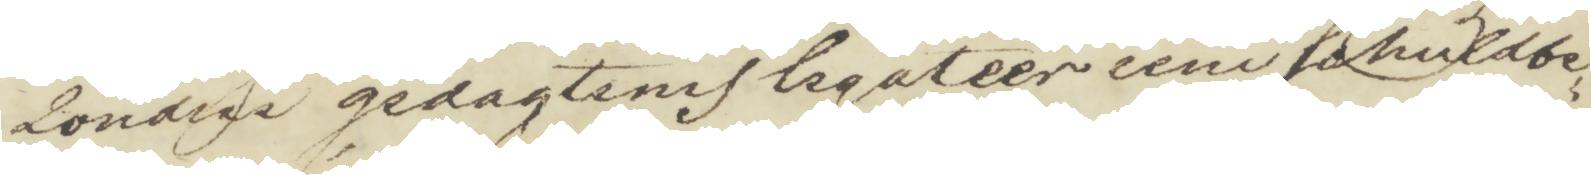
zondere gedagtenis legateer eene schuldbe„
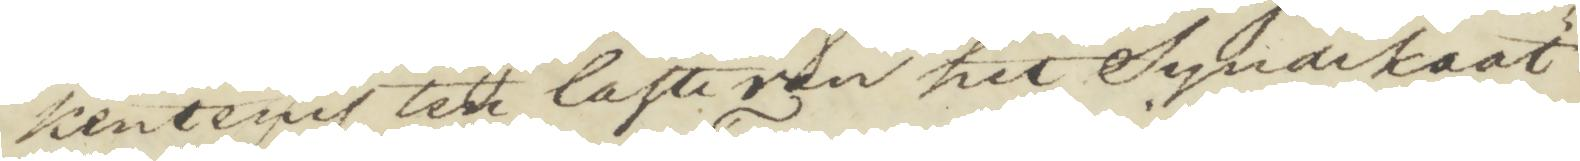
kentenis ten laste van het Syndikaat
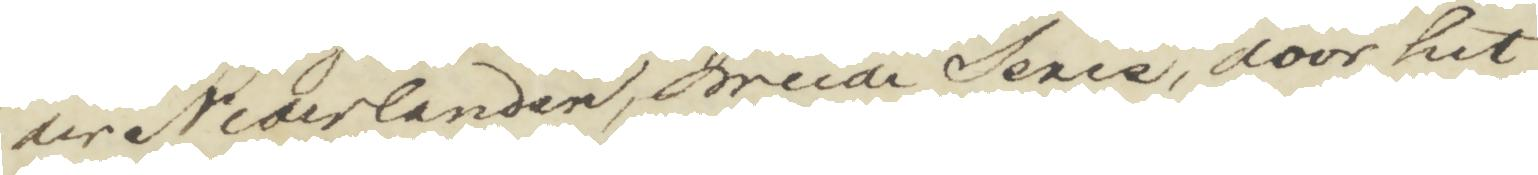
der Nederlanden, Tweede Serie, door het
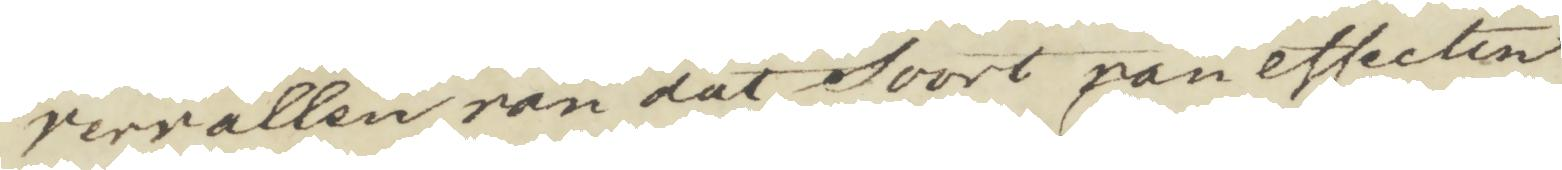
vervallen van dat soort van effecten
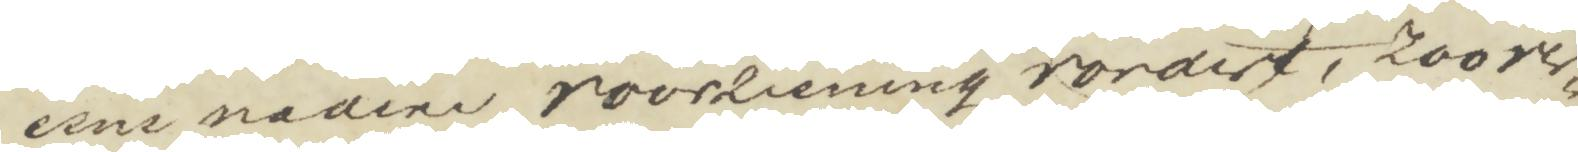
eene nadere voorziening vordert, zoo ver
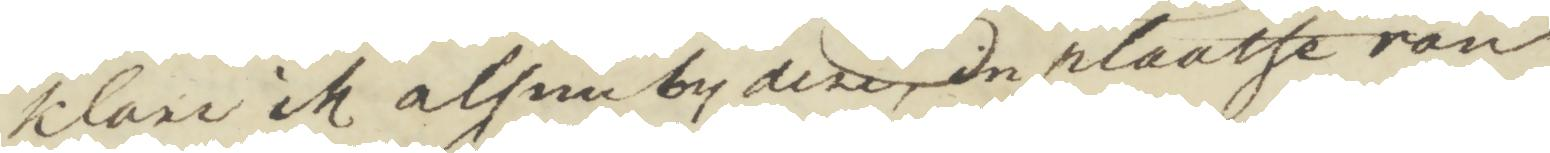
klare ik als nu by deze in plaatse van
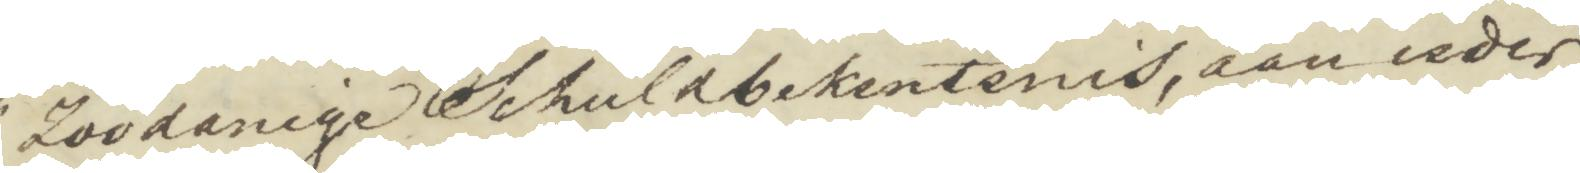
zoodanige Schuldbekentenis, aan ieder
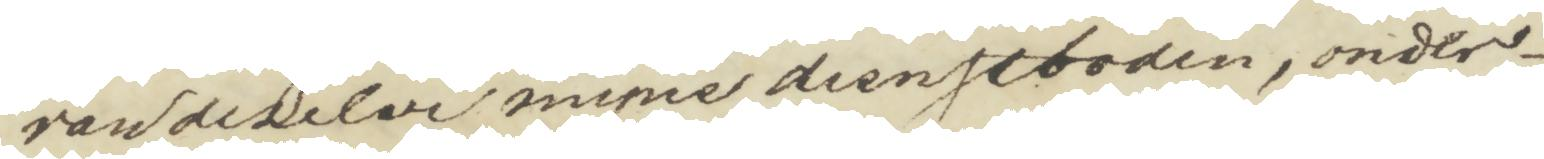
van dezelve myne dienstboden, onder-
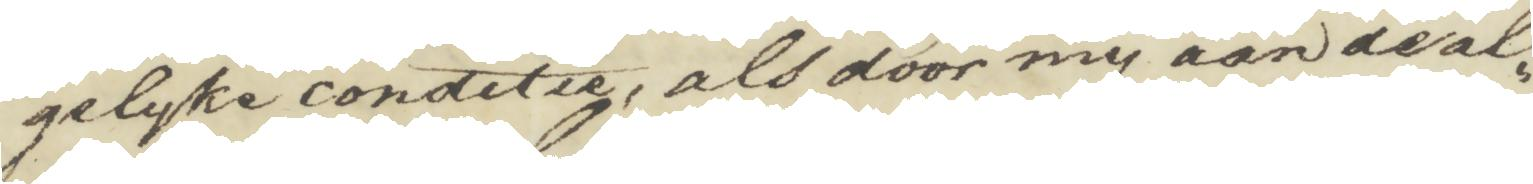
gelyke conditie, als door mij aan de al
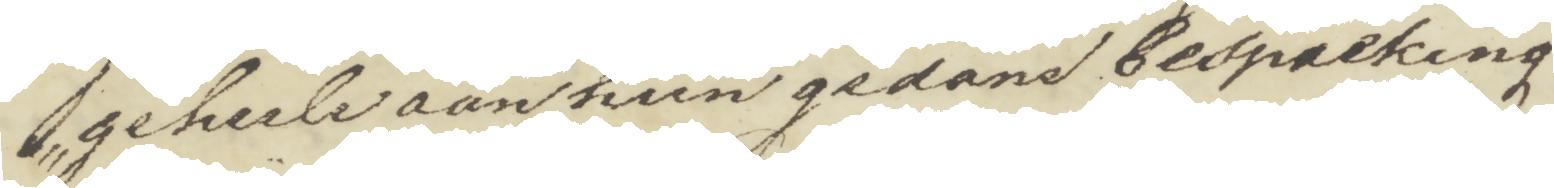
„geheele aan hun gedane bespreking
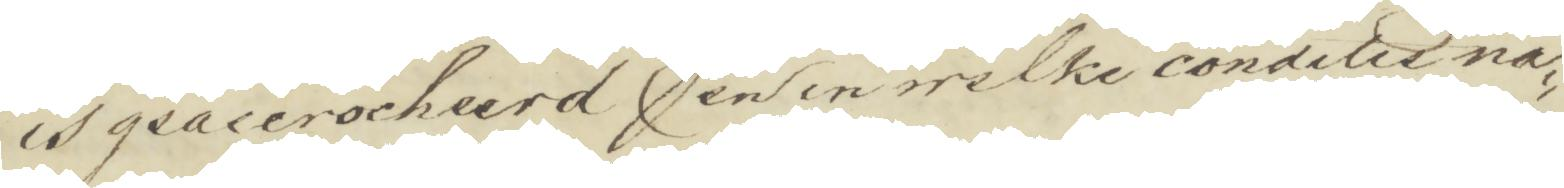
is geäcerocheerd en in welke conditie na„
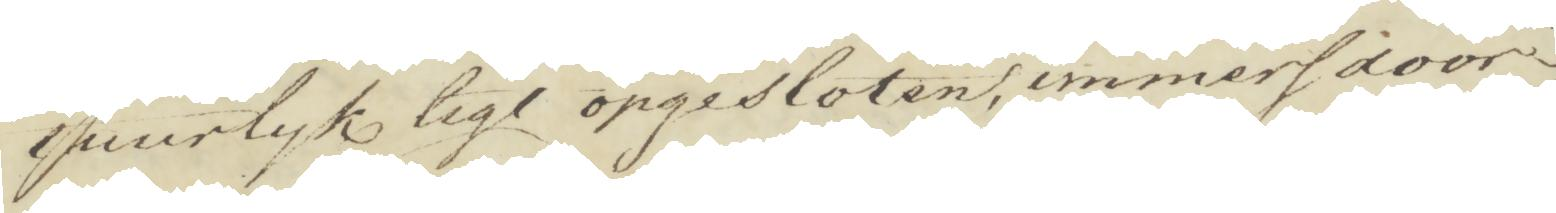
tuurlyk ligt opgesloten, immers door
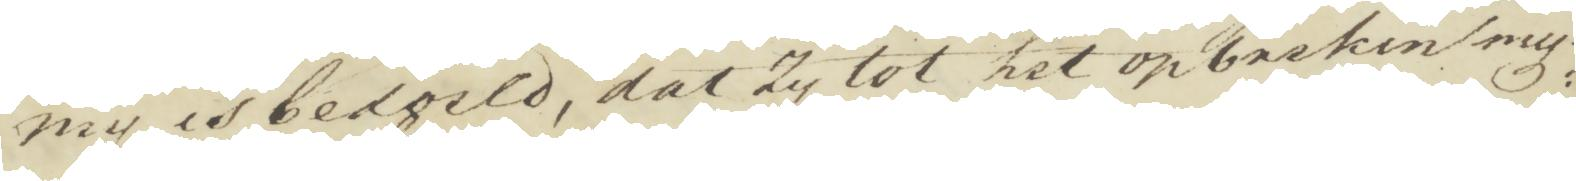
my is bedoeld, dat zy tot het opbreken my
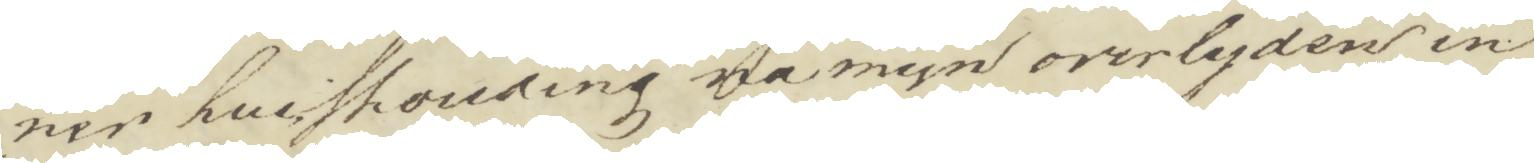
ner huishouding na myn overlyden in
